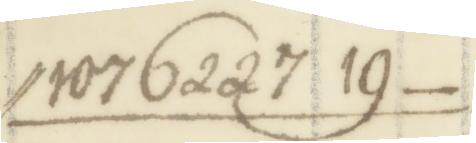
„1076227 19 —
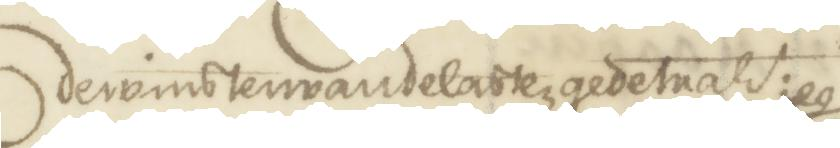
dewinsten van delasten gedetrah:t
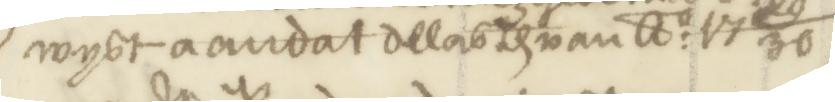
wyst aan dat delasten van a:o 1729/30
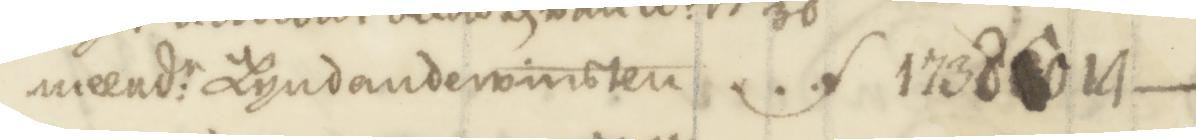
meerd:r zyn dan dewinsten . . .ƒ 173850 14 —
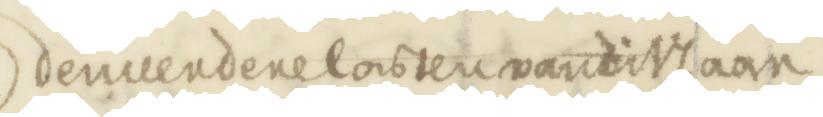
den verdere lasten van dit Jaar
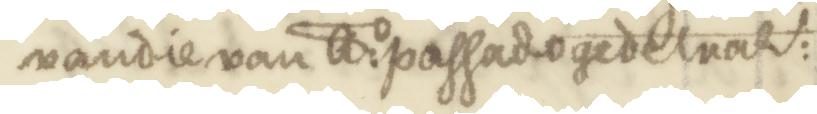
van die van a:o passado gedetrah:t
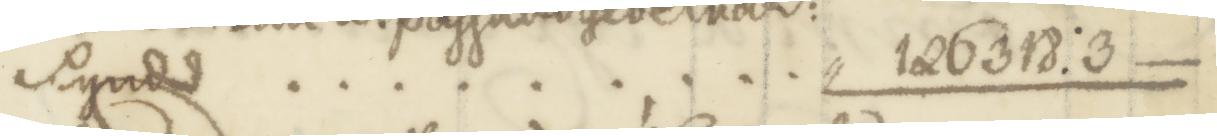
synde . . . . . . . . . „ 126318: 3 —
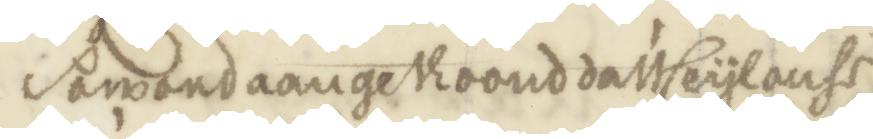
so word aangethoond dat 't Ceijlonse
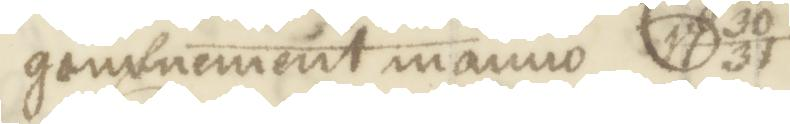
gouvernement in anno 1730/31
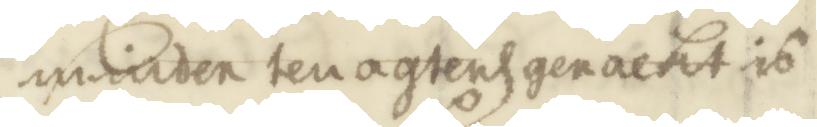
minder ten agters geraekt is
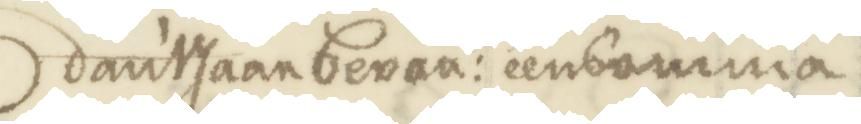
dan't Jaar bevor:s een somma
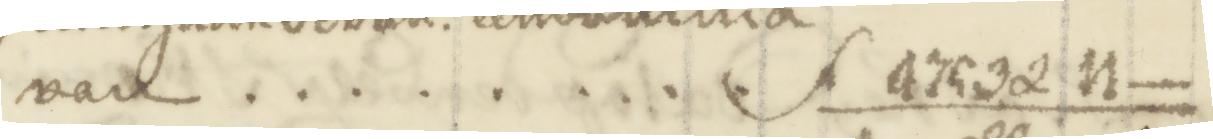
van . . . . . . . . . ƒ 47538 11 —
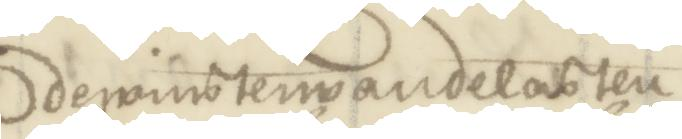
de winsten van de lasten
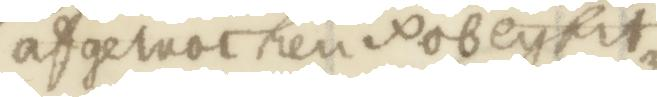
afgetrocken so blykt
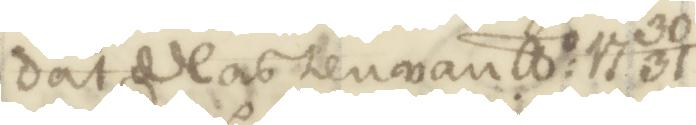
dat delasten van a:o 1730/31
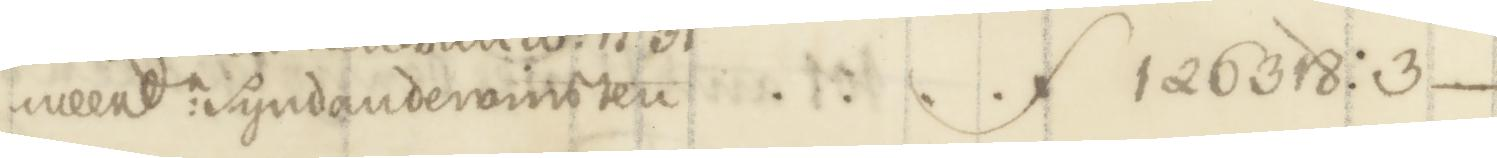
meerd:r syn dan dewinsten . . . . ƒ 126318: 3 —
